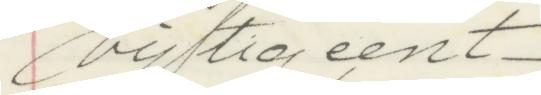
vijftig cent
